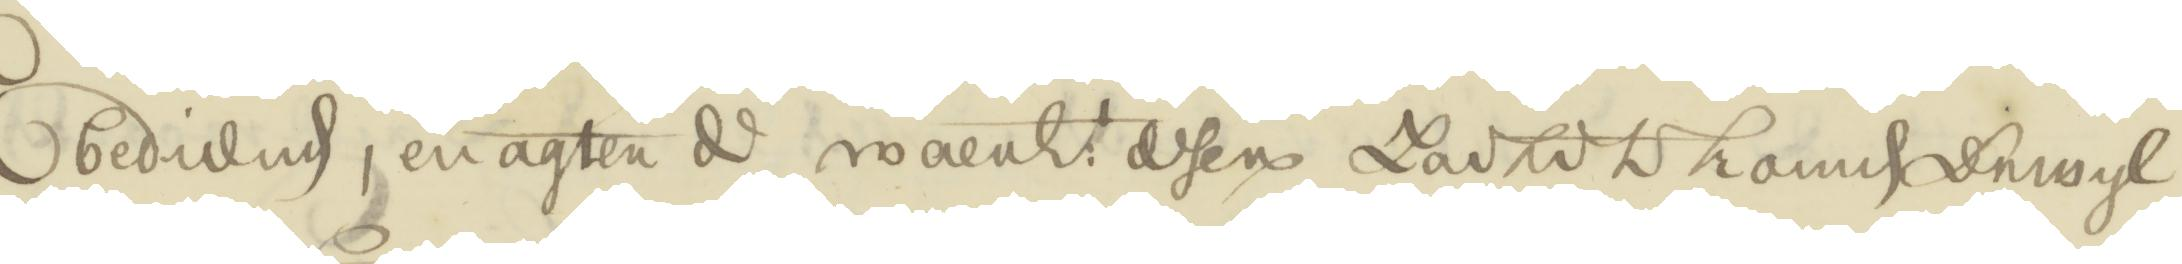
bedienen, en agter de waerh:t deser Zaeke te komen terwyl
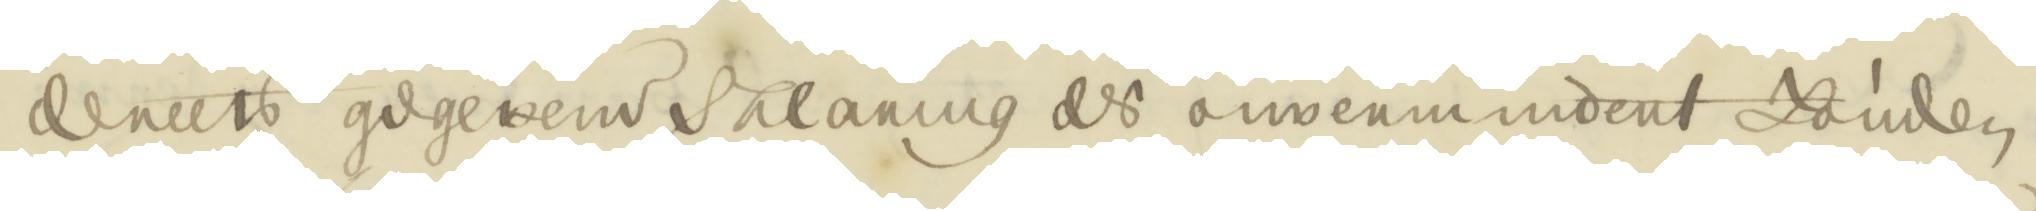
dereets gegevene verklaring des onvermindert Zouden
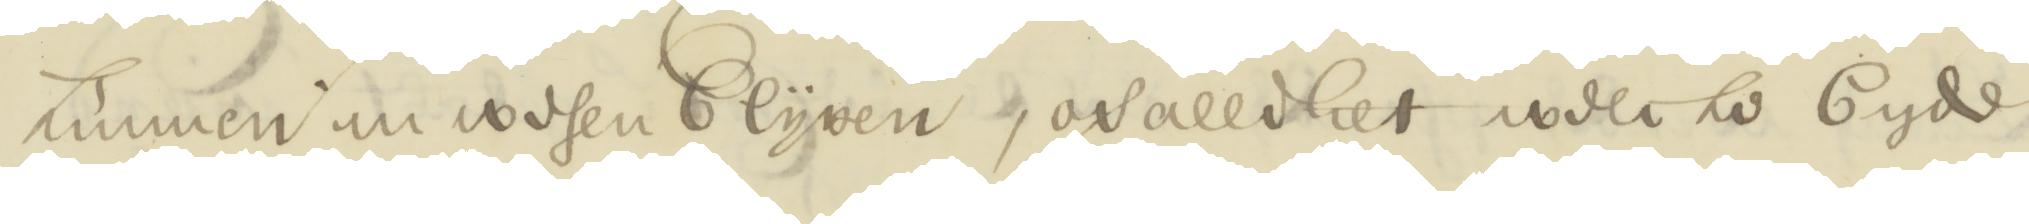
kunnen in wesen blijven, over alle het welcke byde
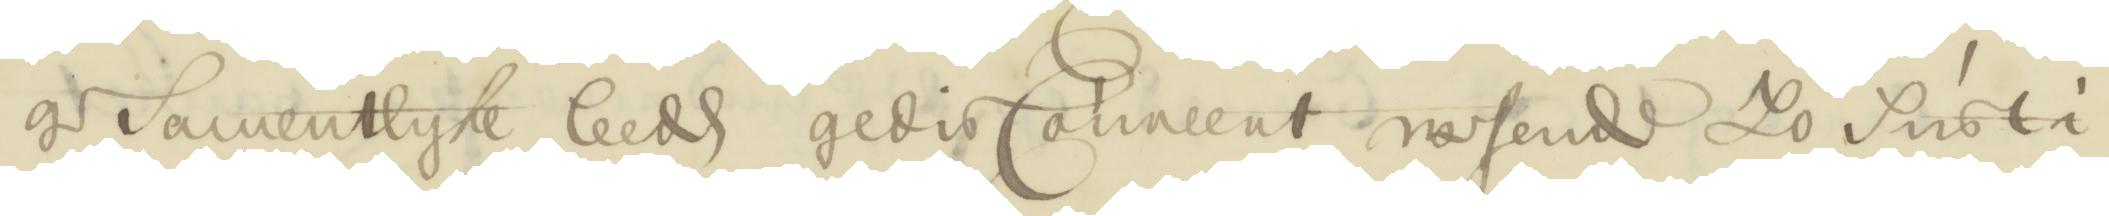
gesamentlyke leeden gediscoureert wesende Zo Susti
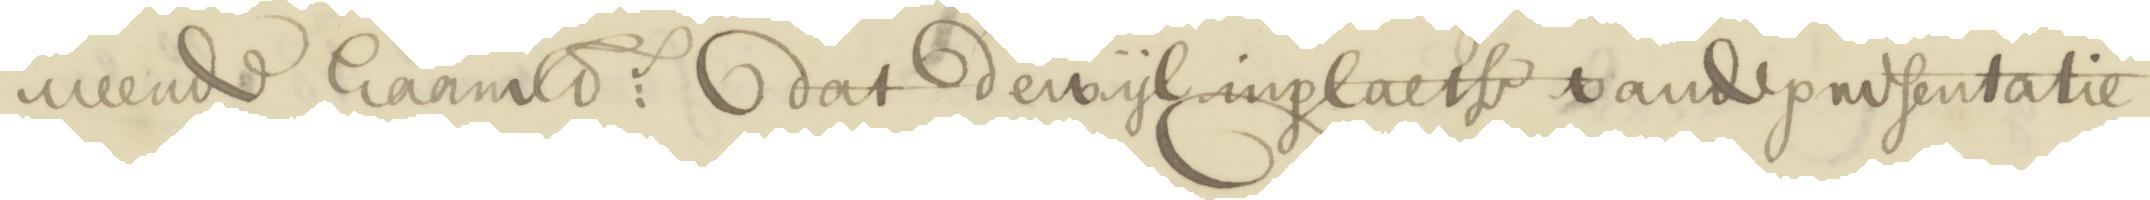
neerde haar Ed:s dat dewijl inplaetse vande presentatie
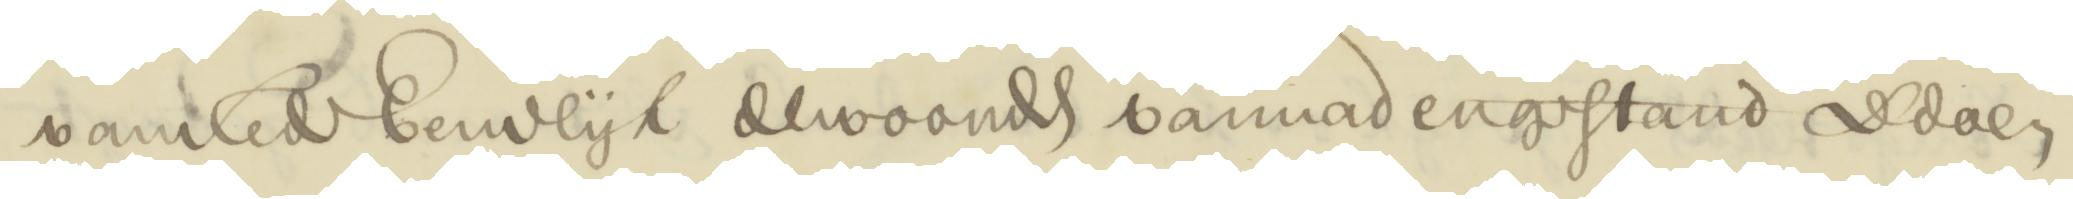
van Eede Eenelijk de woorden van nader gestand te doen
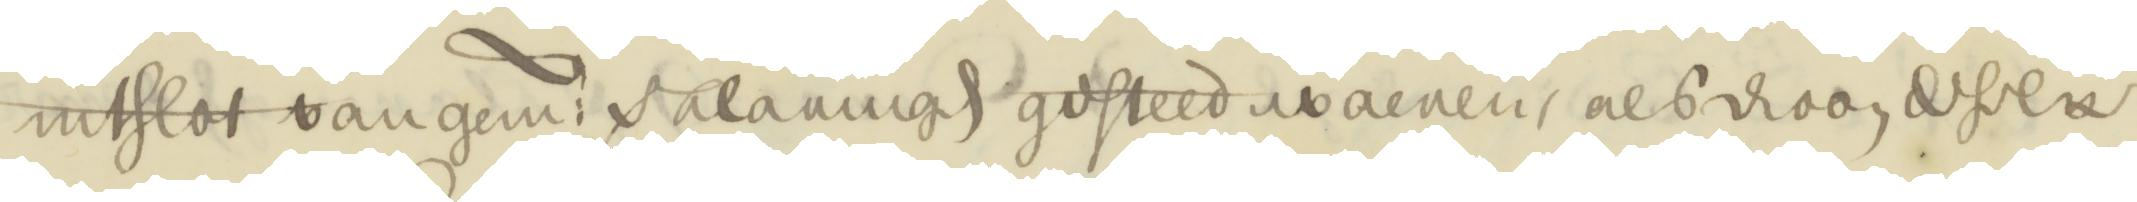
in 'tslot van gem: verklaringen gesteld waeren, als en aan deselve
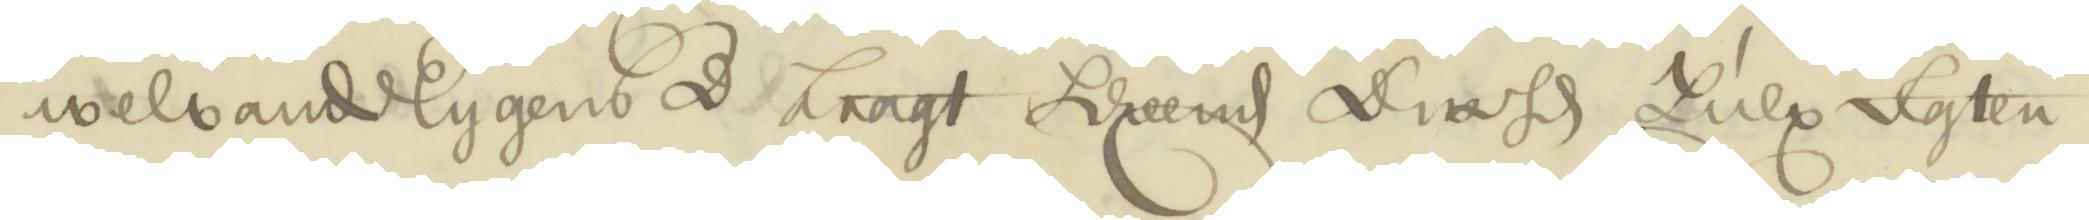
wel vande Eygenste kragt Scheenen te wesen Zulx Egter
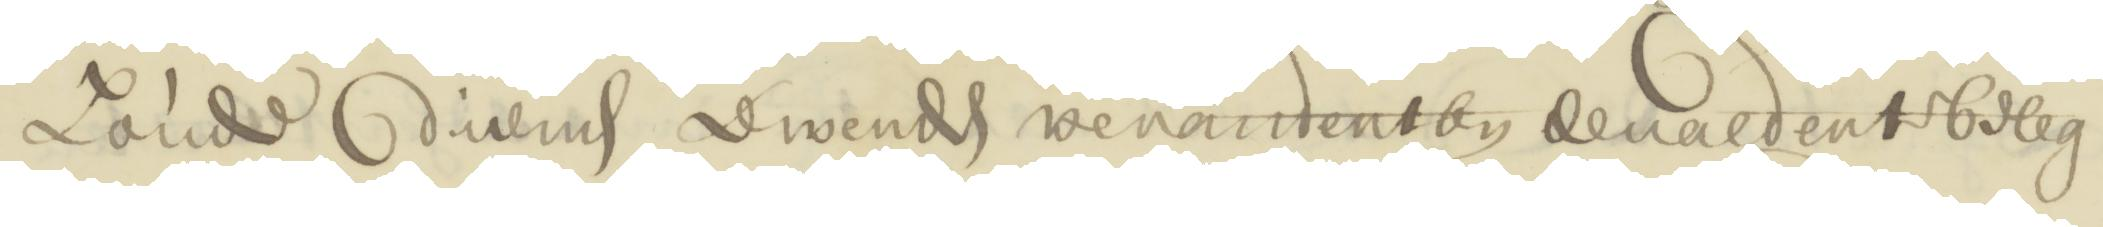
Zoude dienen te werden verandert by den alder te beleg
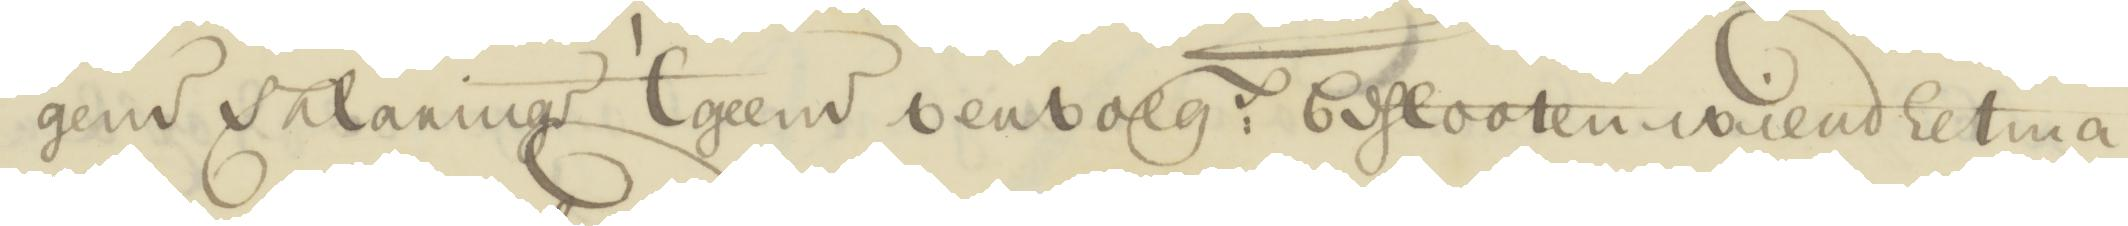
gene verklaringe 't geene vervolg:s beslooten wierd het ma
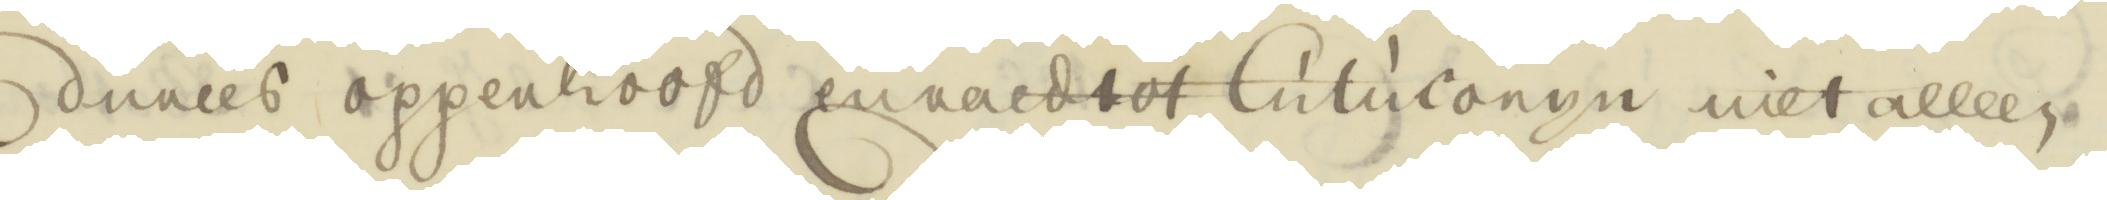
durees opperhoofd en raed tot Tutucoryn niet alleen
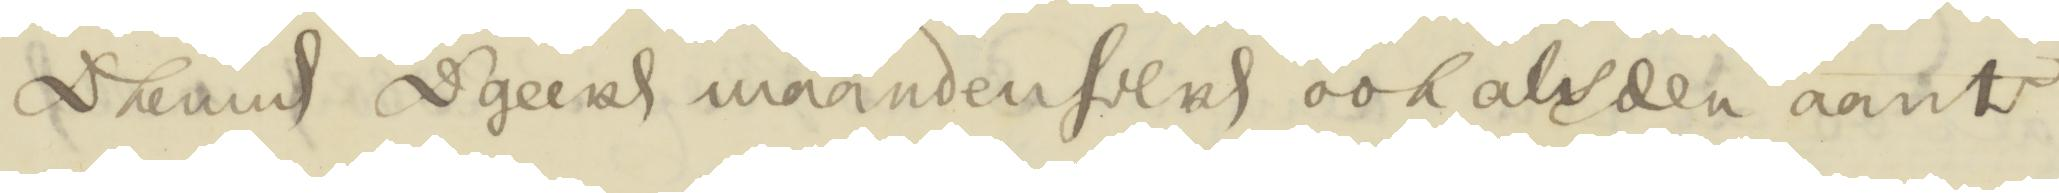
te kennen te geeven maar denselven ook alverder aan te
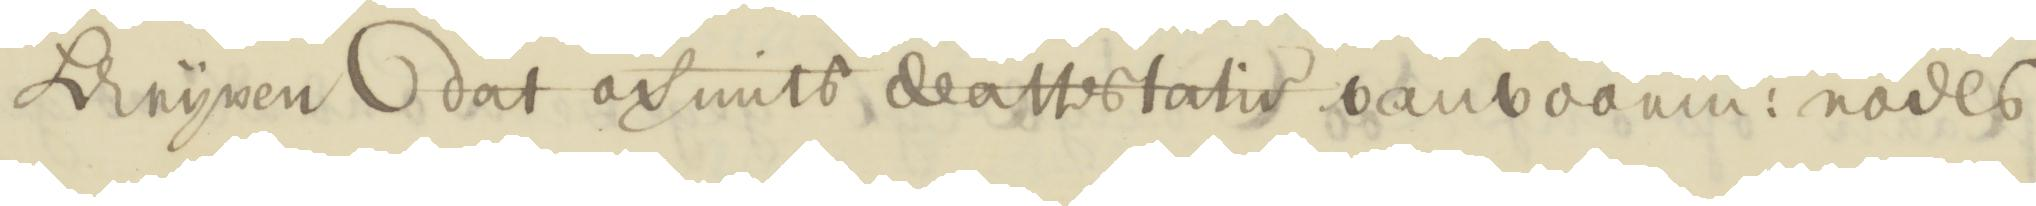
Schrijven dat overmits de attestatie van voorm: roels
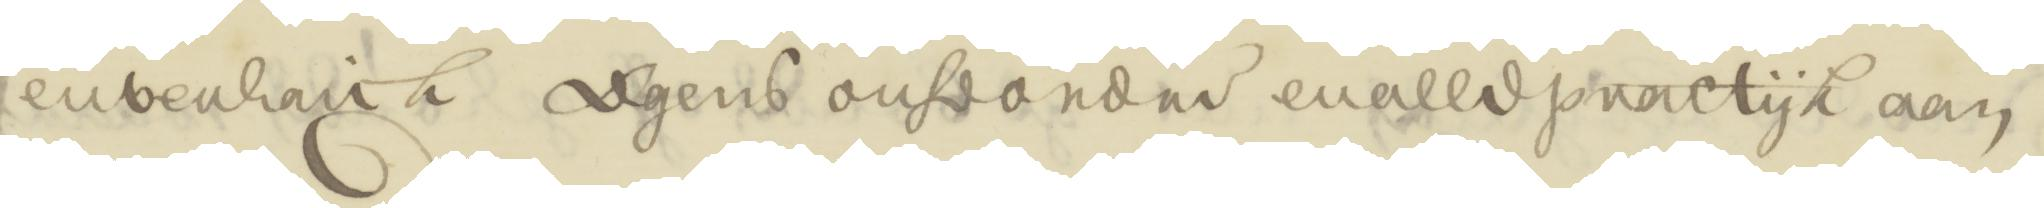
en verhaick tegens onse ordre en alle practijk aan
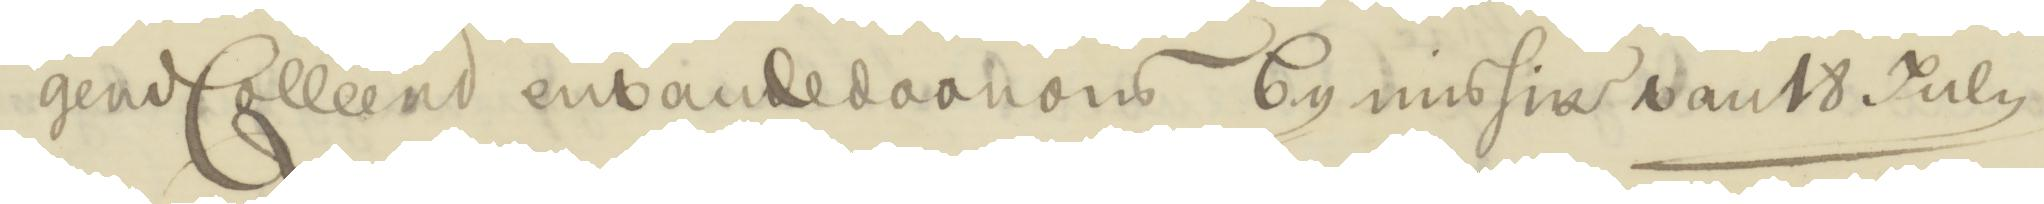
gerecolleerd en vande door ons by missive van 18 Iuly
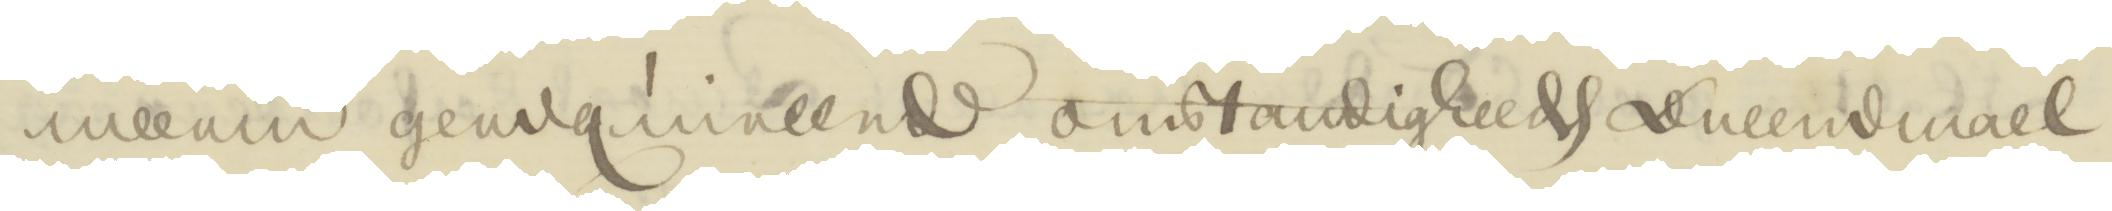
meerm gerequireerde omstandigheeden ten eenemael
